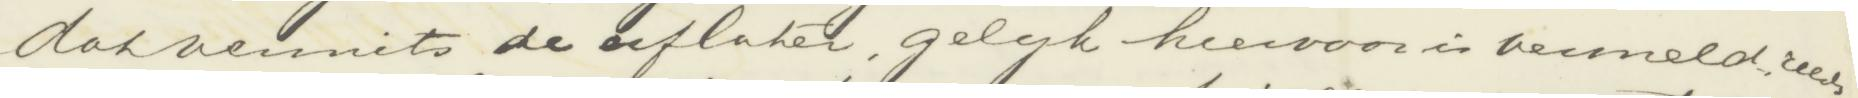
dat vermits de erflater, gelyk hiervoor is vermeld, reeds
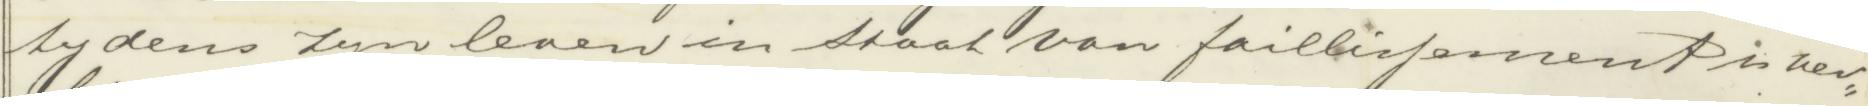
tydens zyn leven in staat van faillissement is ver„
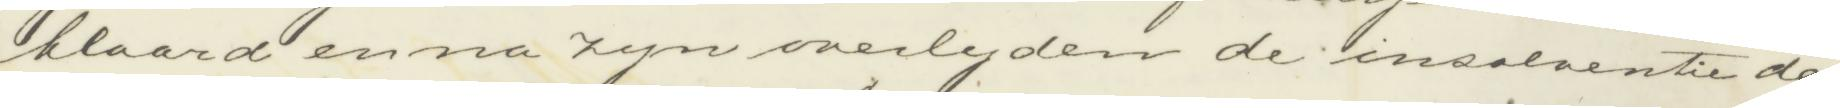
klaard en na zyn overlyden de insolventie des
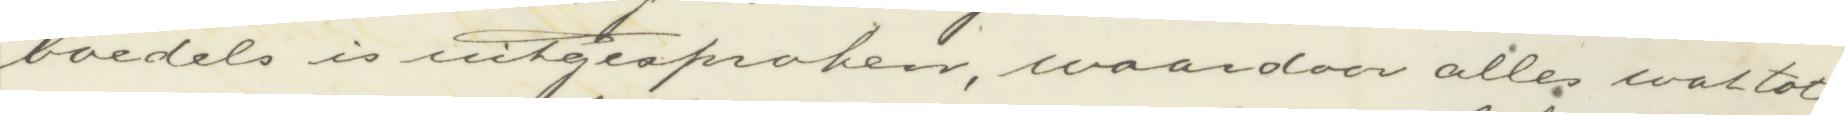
boedels is uitgesproken, waardoor alles wat tot
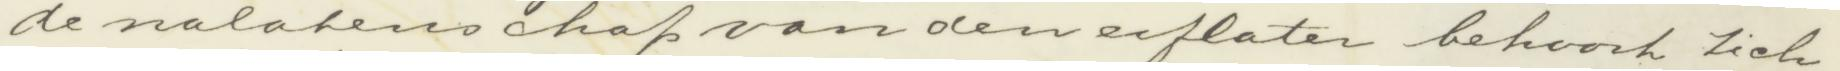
de nalatenschap van den erflater behoort zich
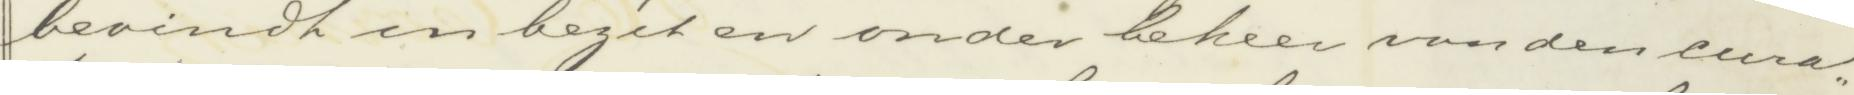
bevindt en bezit en onder beheer van den cura„
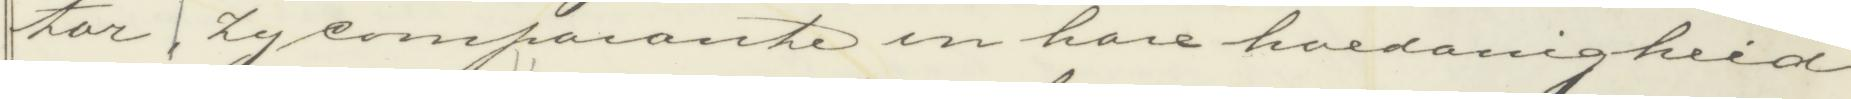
tor|, zy comparante in hare hoedanigheid
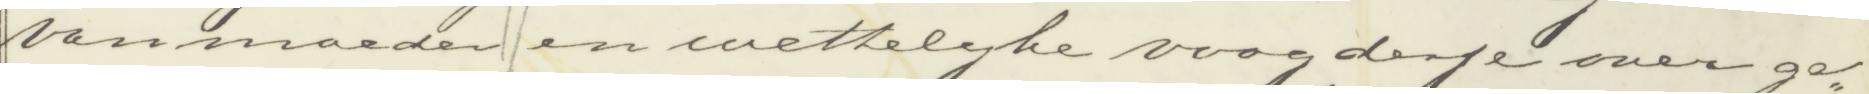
van moeder|| en wettelyke voogdesse over ge„
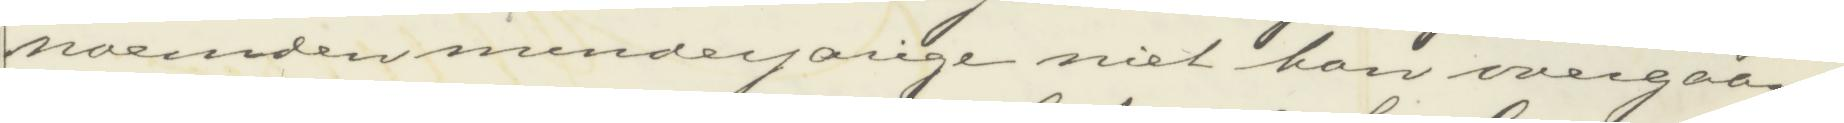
noemden minderjarige niet kon overgaan
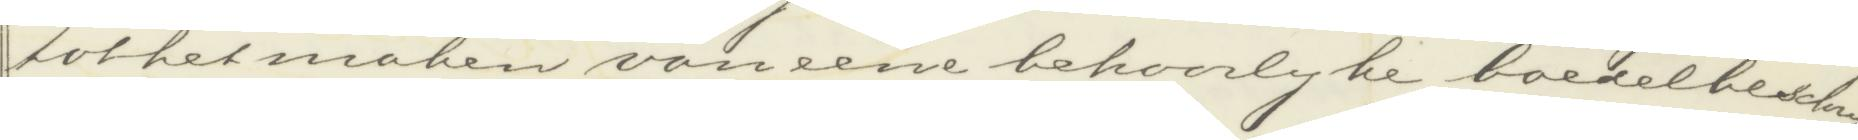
tot het maken van eene behoorlyke boedelbeschry
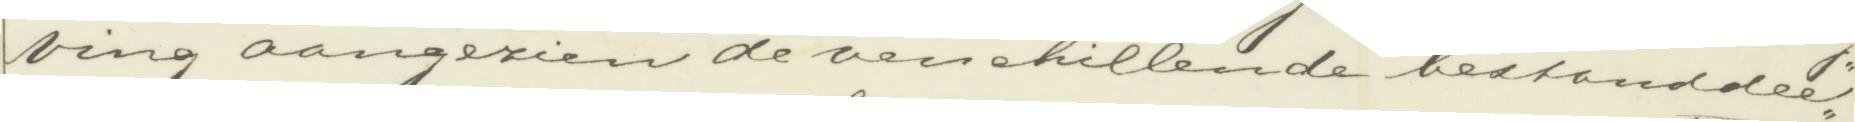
ving aangezien de verschillende bestanddee„
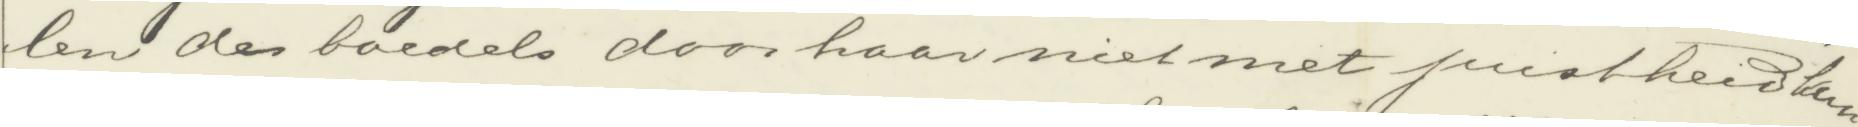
len des boedels door haar niet met juistheid kun
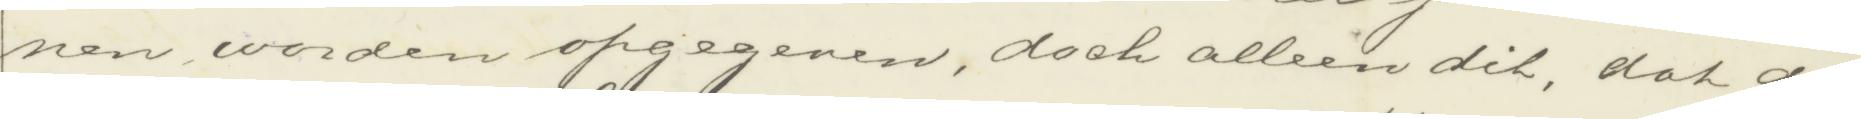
nen worden opgegeven, doch alleen dit, dat de
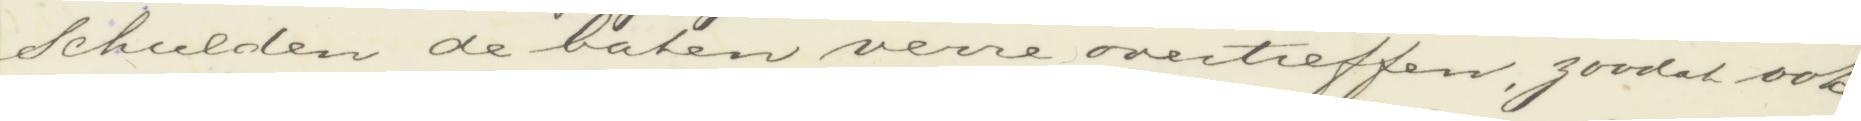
schulden de baten verre overtreffen, zoodat ook
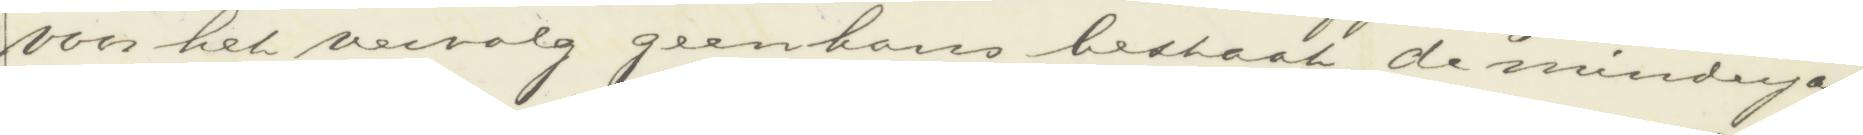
voor het vervolg geen kans bestaat, de minderja
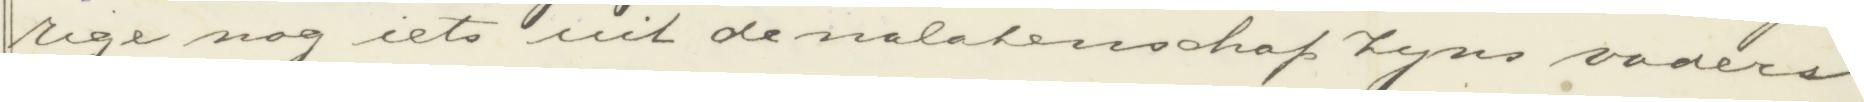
ige nog iets uit de nalatenschap zyns vader
